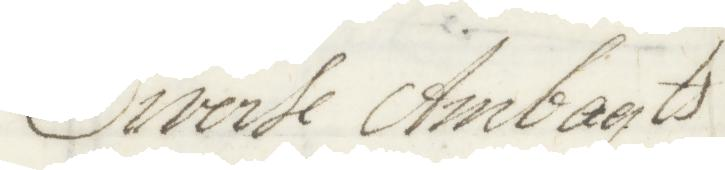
Diverse Ambagts
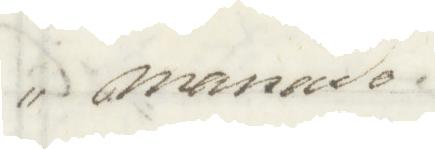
„ manado
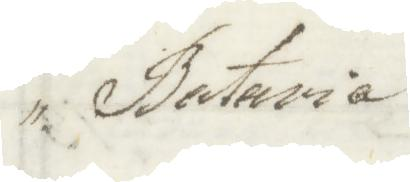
„ Batavia
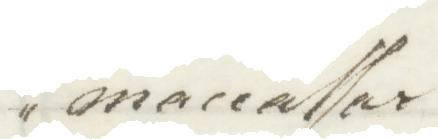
„ maccassar
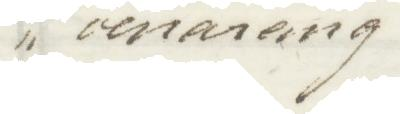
„ oenarang
